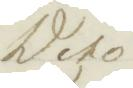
Dito . . . . . . . .
